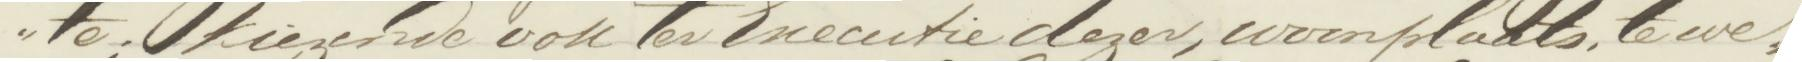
„te: kiezende ook ter Executie dezer, woonplaats, te we„
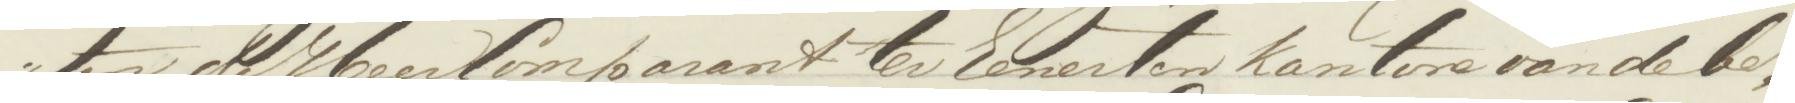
„ten, de Heer Comparant ter Eener ten kantore van de be„
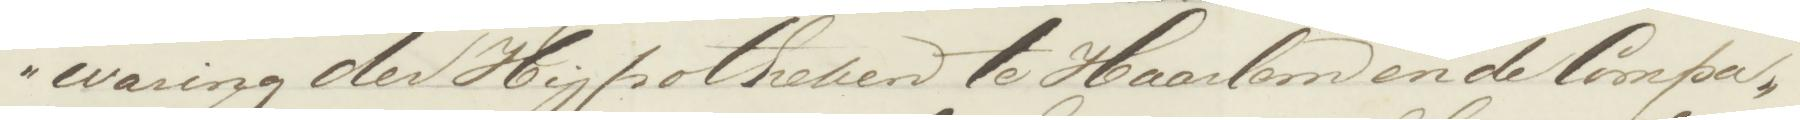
„waring der Hijpotheken te Haarlem en de Compa„
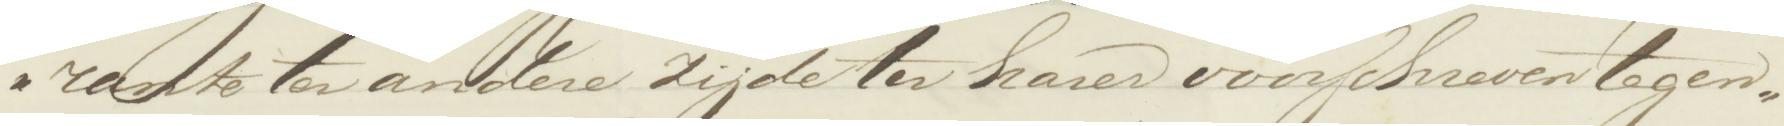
„rante ter andere zijde ter harer voorschreven tegen„
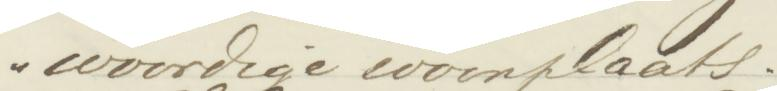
„woordige woonplaats
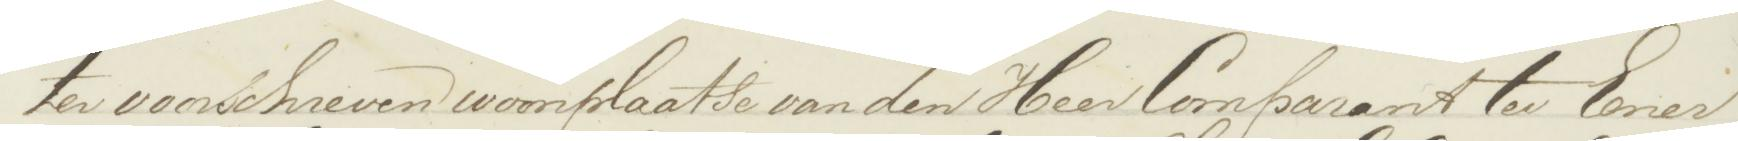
ter voorschreven woonplaatse van den Heer Comparant ter Eener
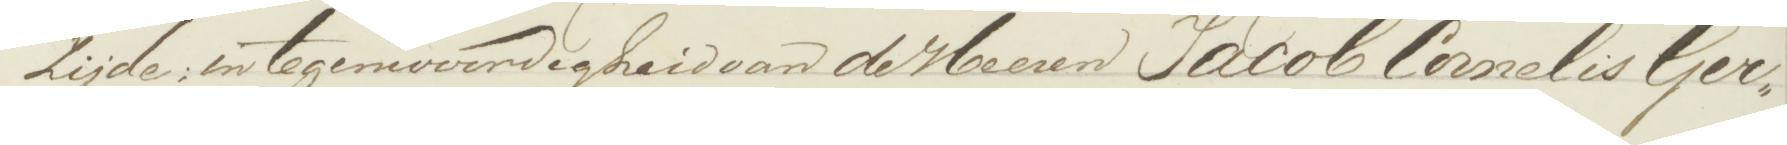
zijde: in tegenwoordigheid van de Heeren Jacob Cornelis Ger„
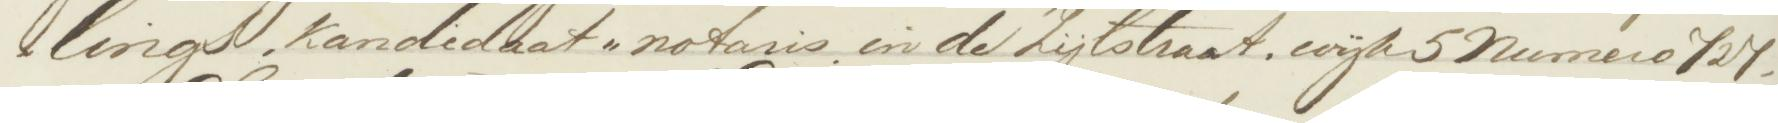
lings, kandidaat „ notaris, in de Zijlstraat, wijk 5 Numero 727.
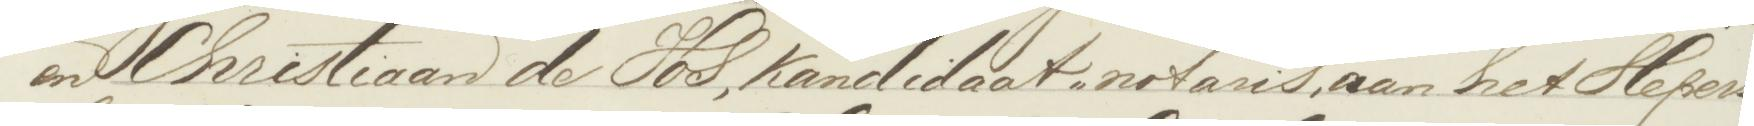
en Christiaan de Vos, kandidaat „ notaris, aan het Slepers„
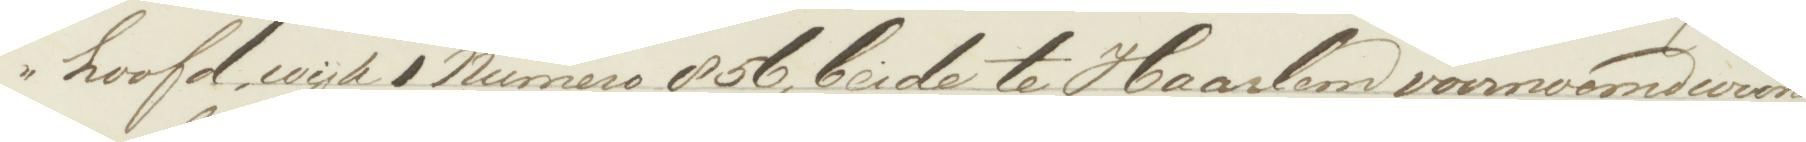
„hoofd, wijk 1 Numero 856, beide te Haarlem voornoemd woon
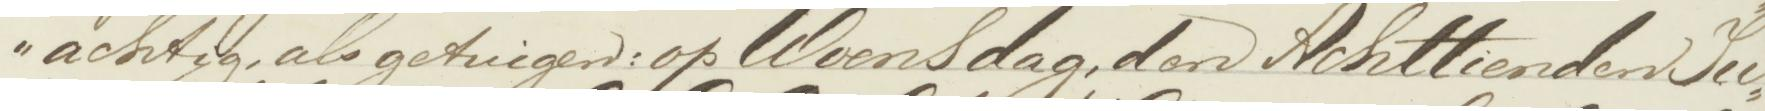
„achtig, als getuigen: op Woensdag, den Achttienden Ju„
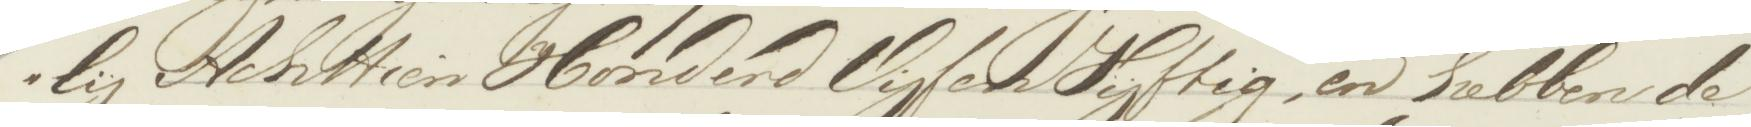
„lij Achttien Honderd Vijf en Vijftig, en hebben de
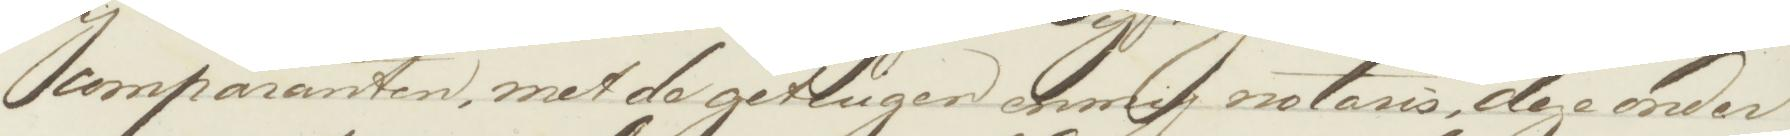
comparanten, met de getuigen enmij notaris, deze onder
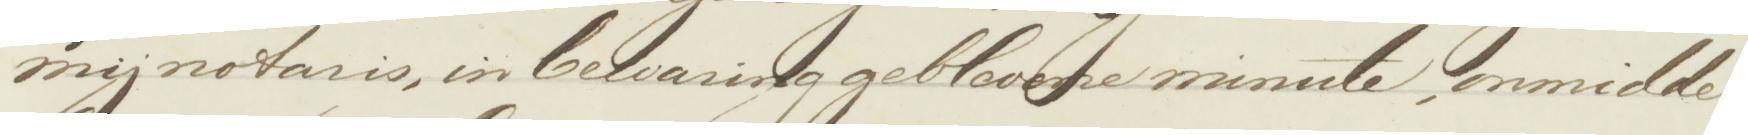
mij notaris, in bewaring geblevene minute onmidde
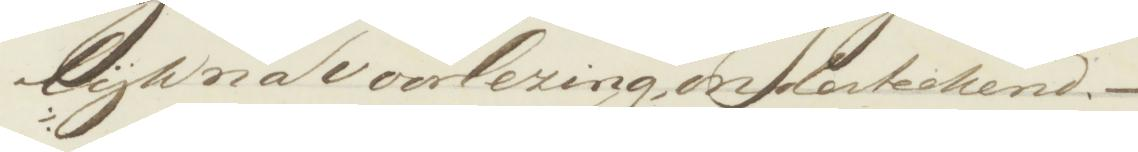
„lijk na voorlezing, onderteekend.-
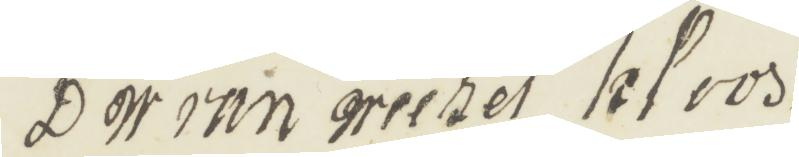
DW van weezel kloos
